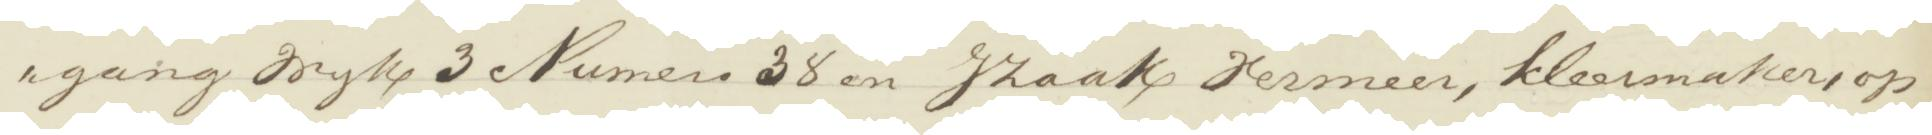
gang Wyk 3 Numero 38 en Jzaak Vermeer, kleermaker, op
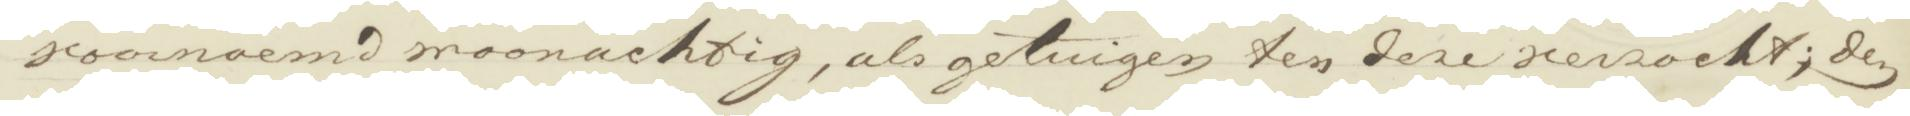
voornoemd woonachtig, als getuigen ten deze verzocht; den
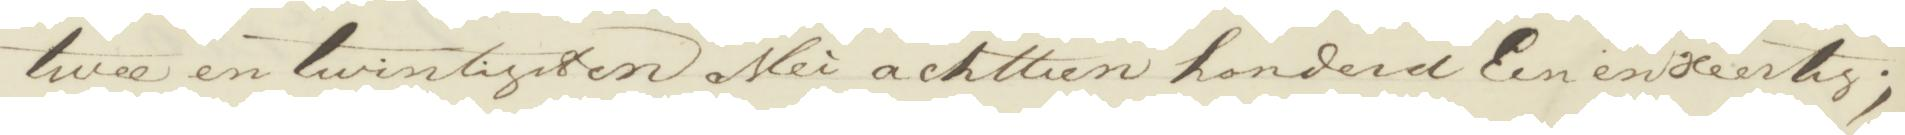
twee en twintigten Mei achttien honderd Een en veertig;
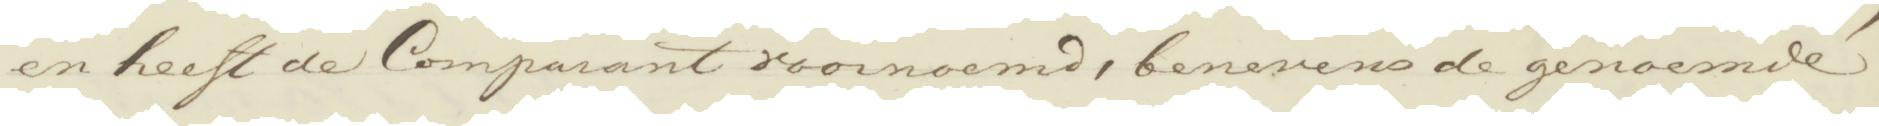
en heeft de Comparant voornoemd, benevens de genoemde
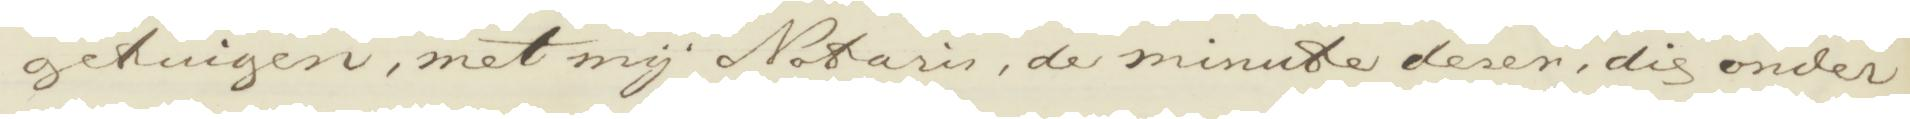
getuigen, met mij Notaris, de minute dezer, die onder
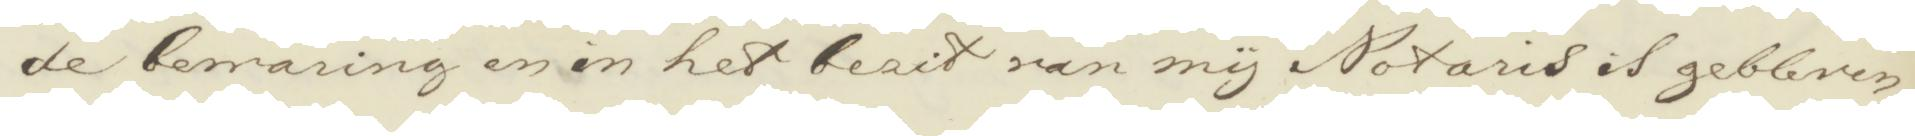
de bewaring en in het bezit van mij Notaris is gebleven
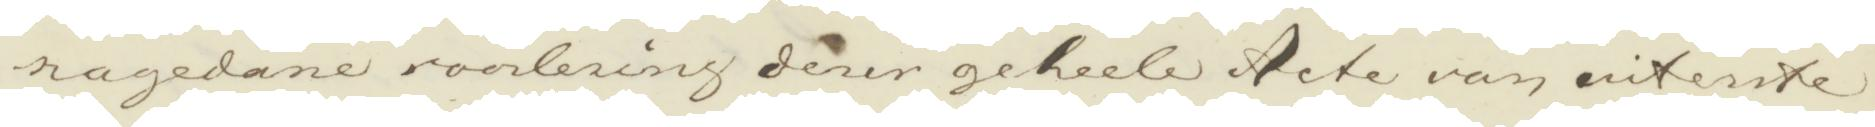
nagedane voorlezing dezer geheele Acte van uiterste
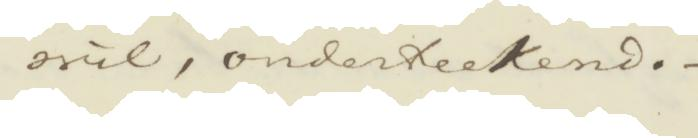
wil, onderteekend.
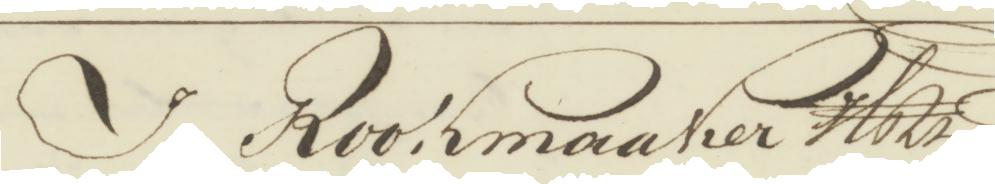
I: Rookmaaker Hstz
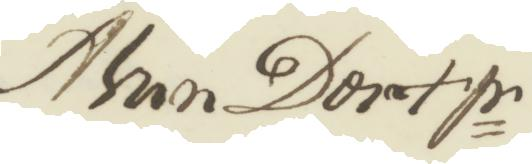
A Van Dort jr=
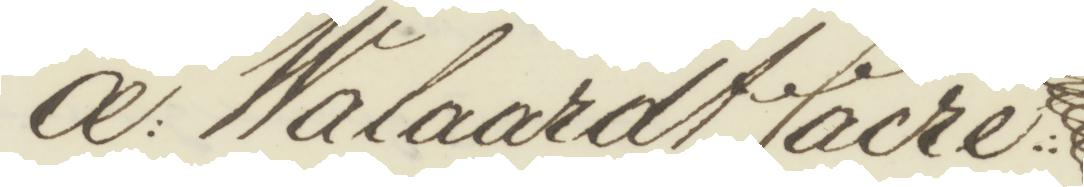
a: Walaardt Sacré.:
